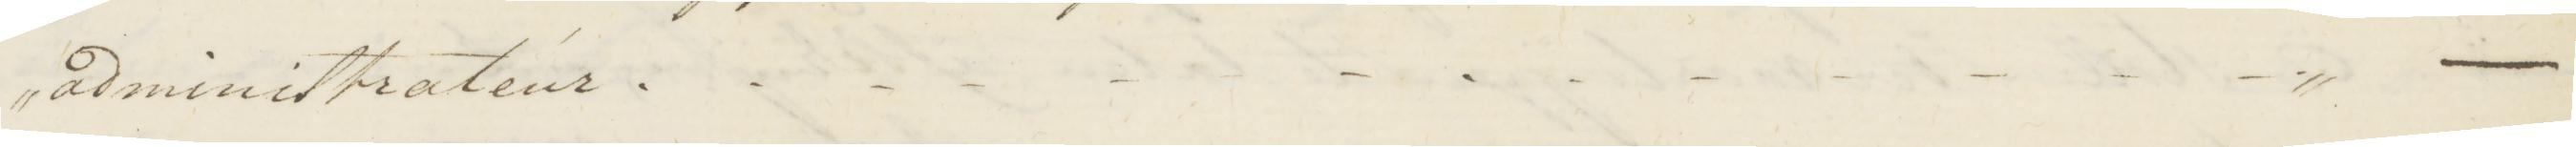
„administrateur - - - – – – - - – - – – – -„ —
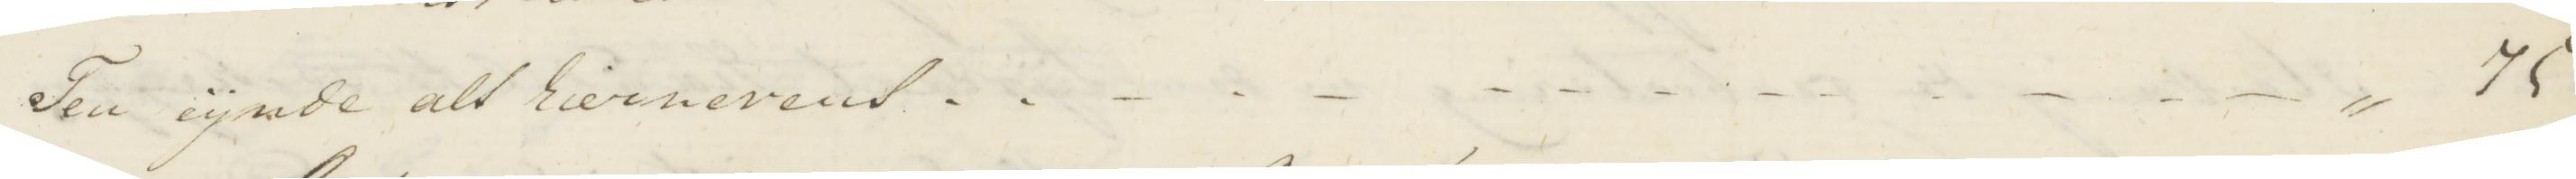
Ten eijnde als hiernevens - - – - – – – – – - - – – – „75
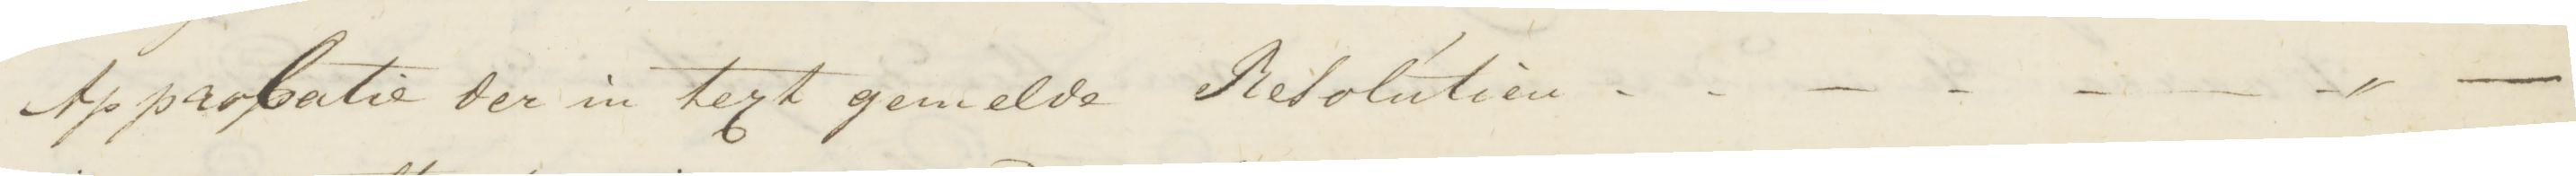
Approbatie der in text gemelde Resolutien - - – – – – – „ —
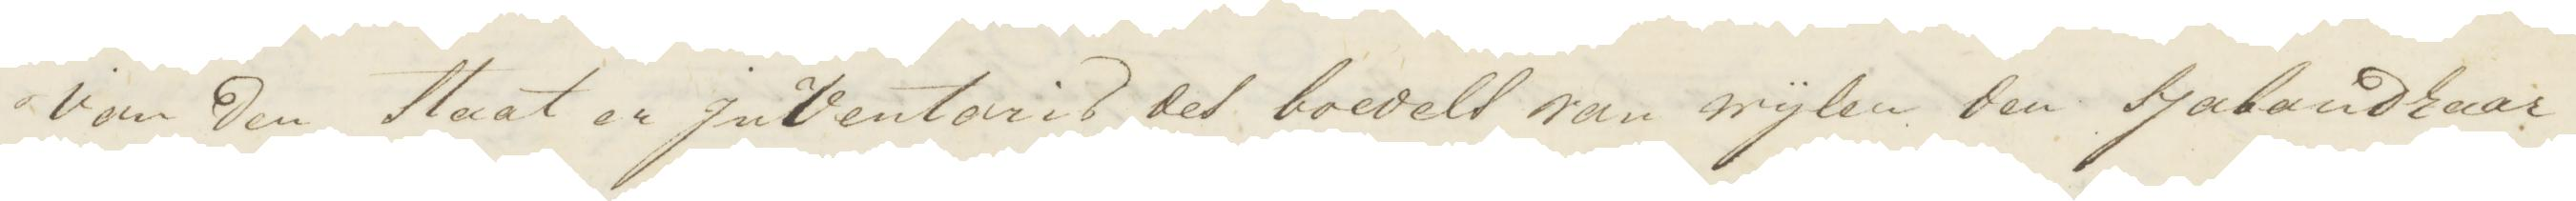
van den staat en jnventaris des boedels van wijlen den sjabandhaar
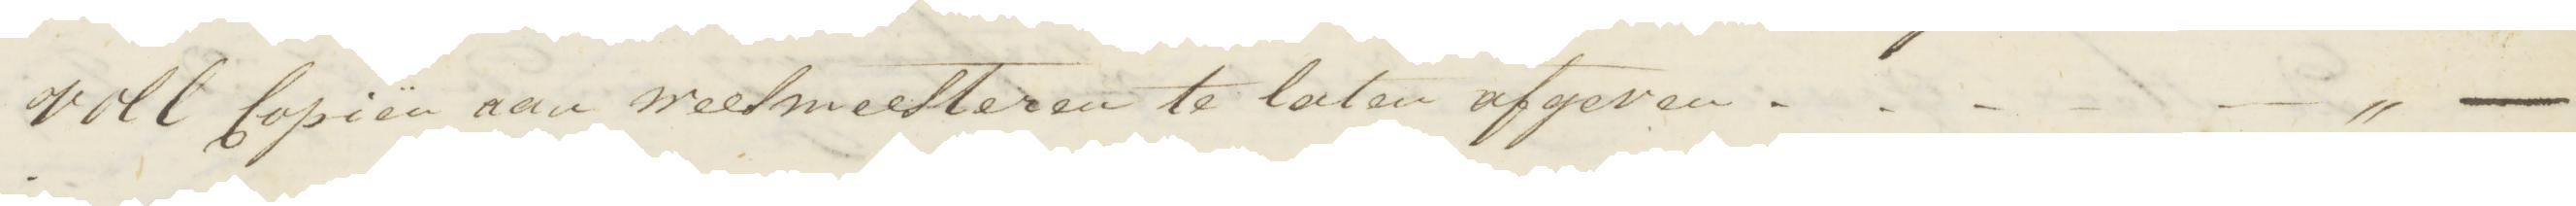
voll Copiën aan weesmeesteren te laten afgeven - - – – – „ —
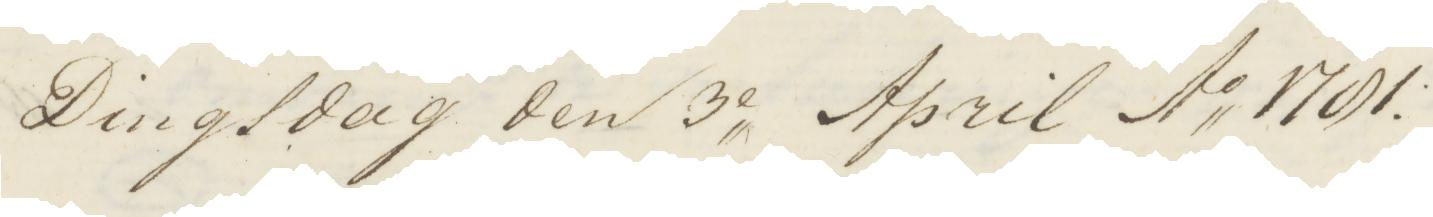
Dingsdag den 3„e April A„o 1781.
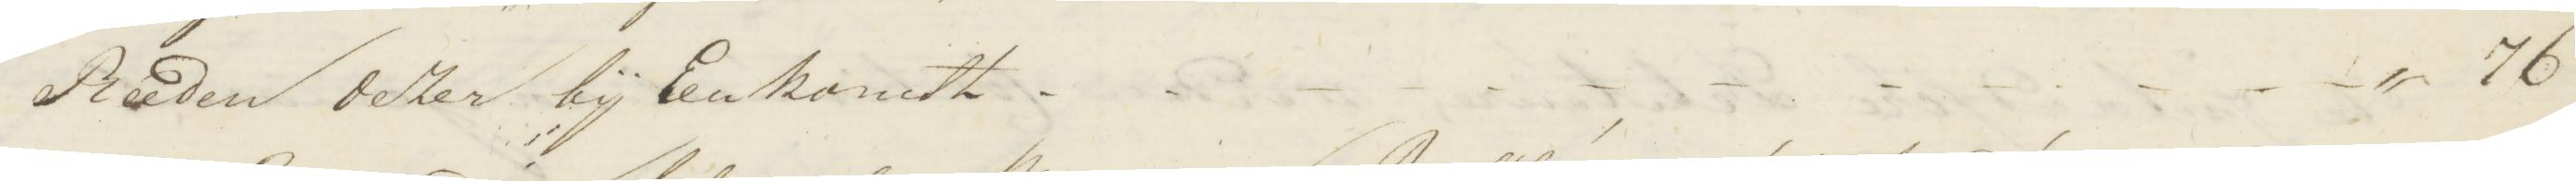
Reeden dezer bij Eenkomst - - – – - – – – - - – – – „ 76
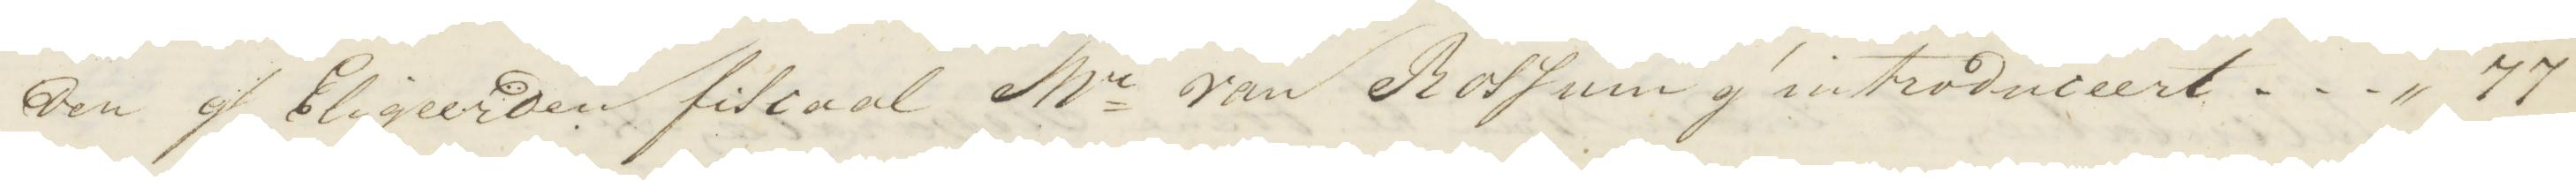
den g' Eligeerden fiscaal M=r van Rossum g’introduceert - - - „ 77
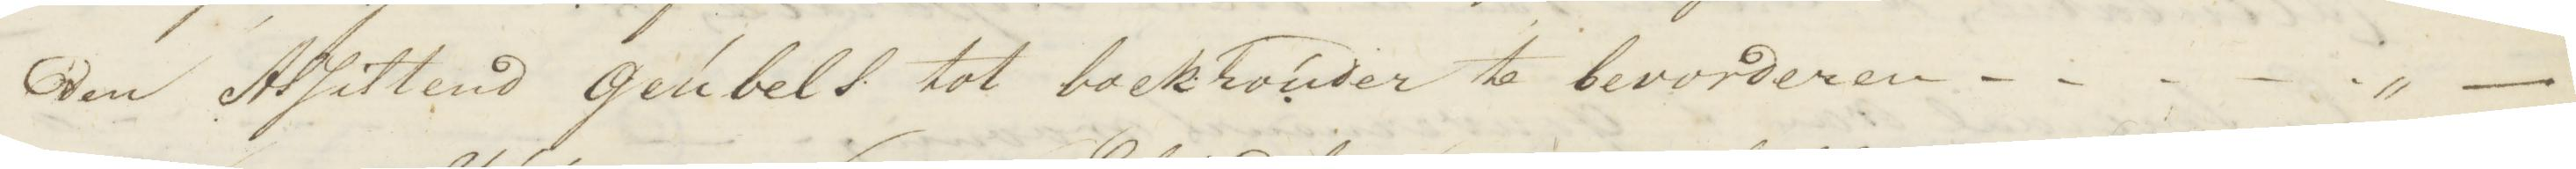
den Assittend geubels tot boekhouder te bevorderen – – – – - „ —
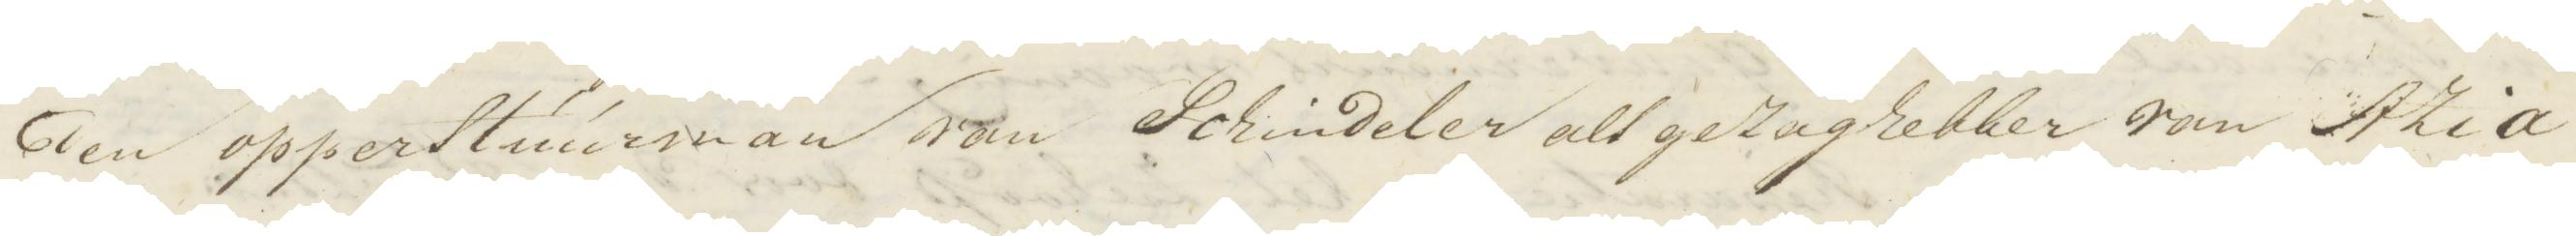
den opperstuurman van Schindeler als gezaghebber van Azia
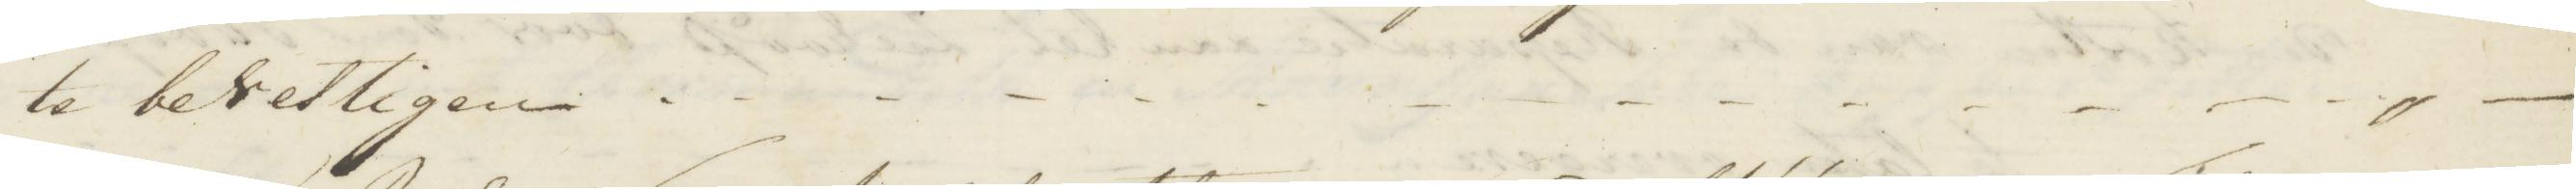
te bevestigen - - – – – - – – – – – - – – – -„ —
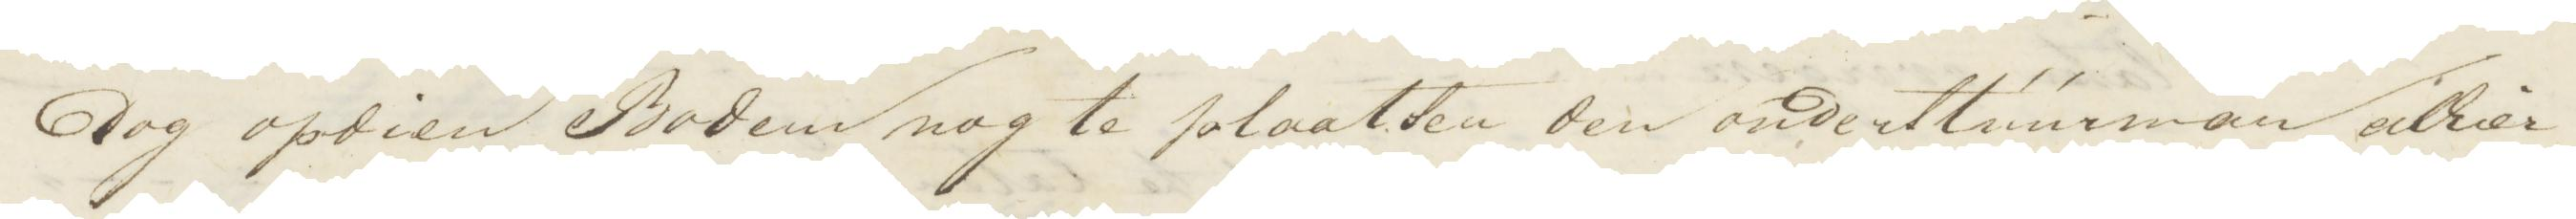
dog opdien Bodem nog te plaatsen den onderstuurman alhier
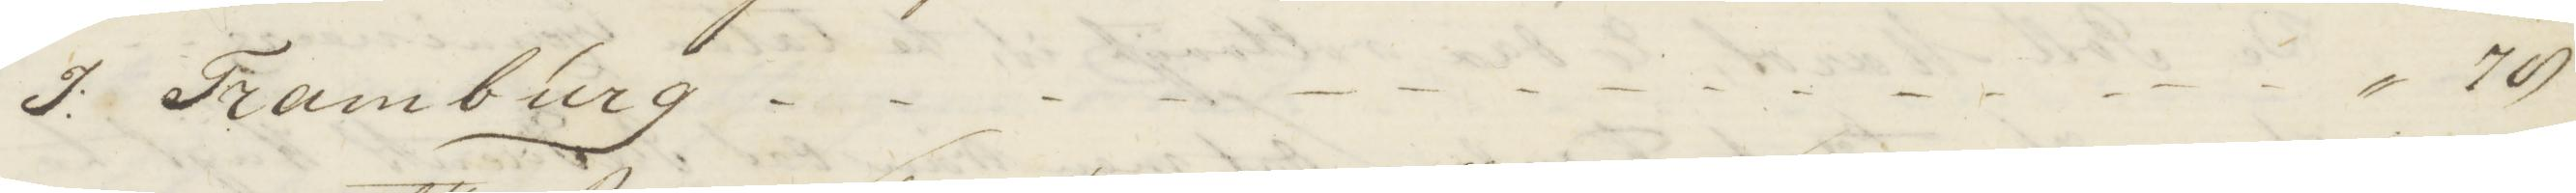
I: Framburg – – – – – – – – – – – – – – – „ 78
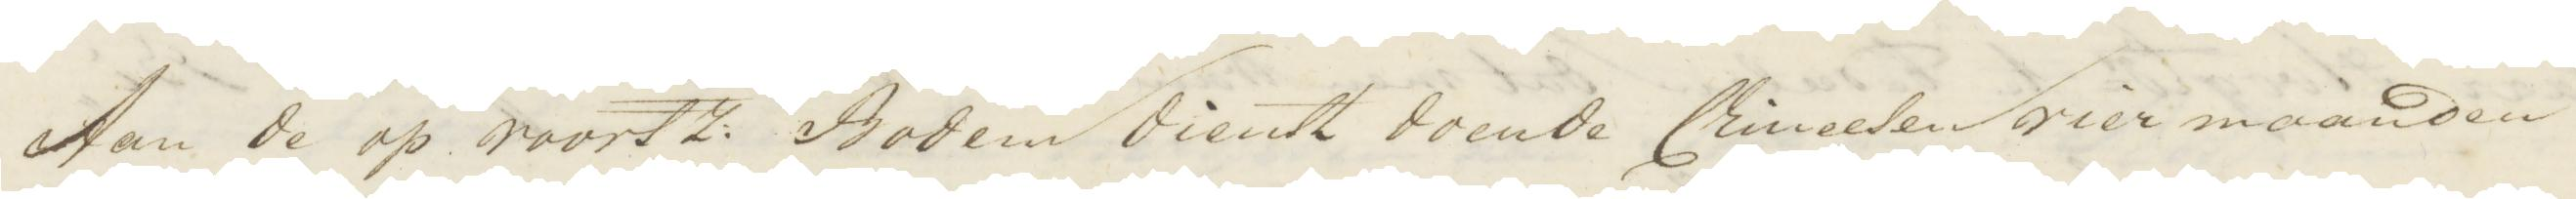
Aan de op voorsz: Bodem dienst doende Chineesen vier maanden
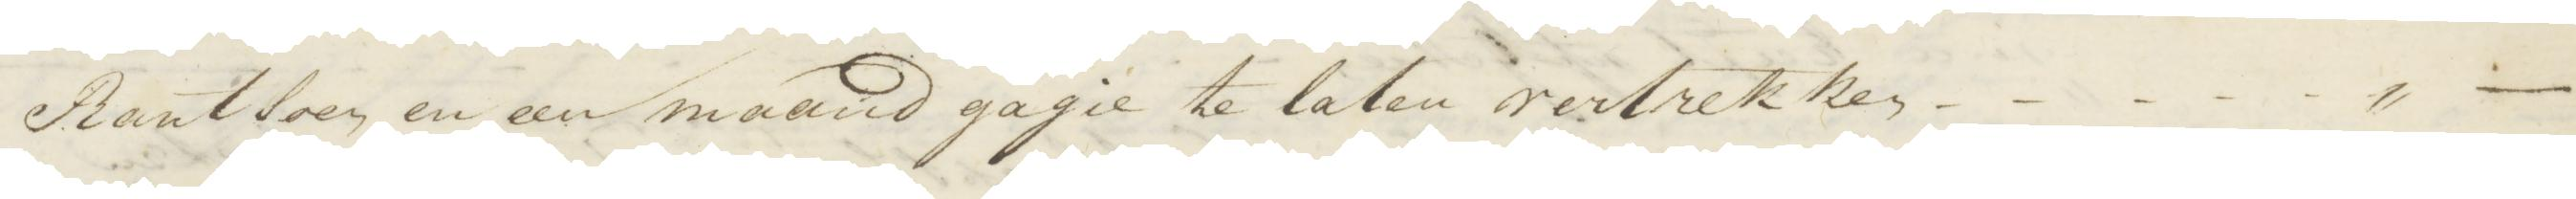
Rantsoen en een maand gagie te laten vertrekken – – - - - „ —
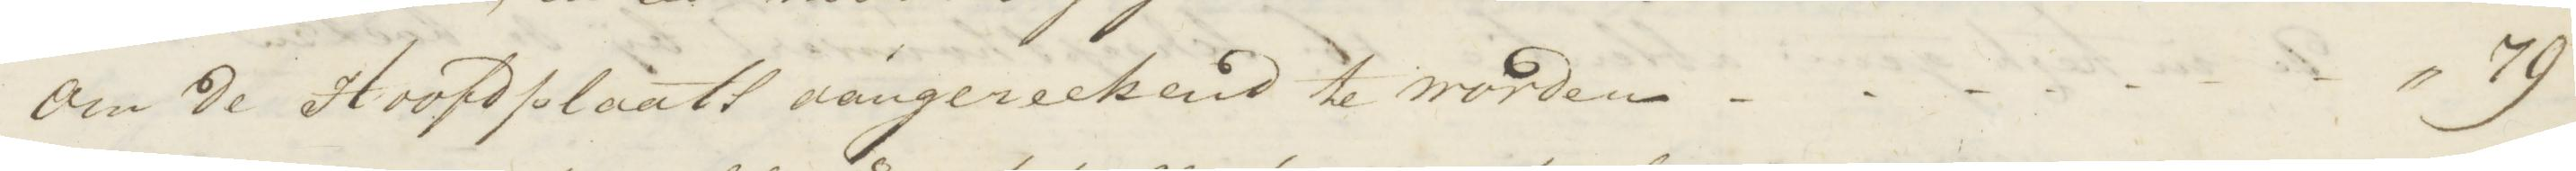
om de Hoofdplaats aangereekend te worden – - – - - – – „ 79
